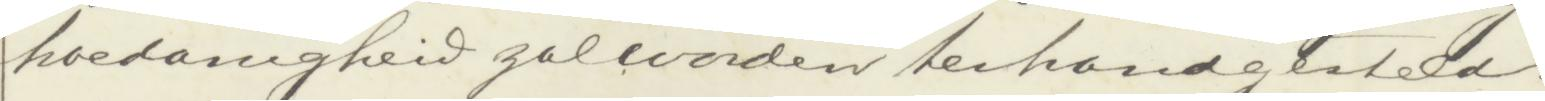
hoedanigheid zal worden terhandgesteld
